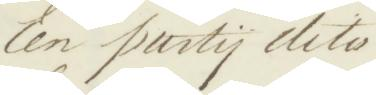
Een partij dito
